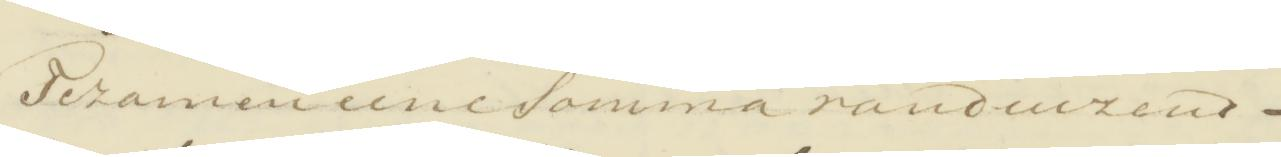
Tezamen eene somma van duizend —
